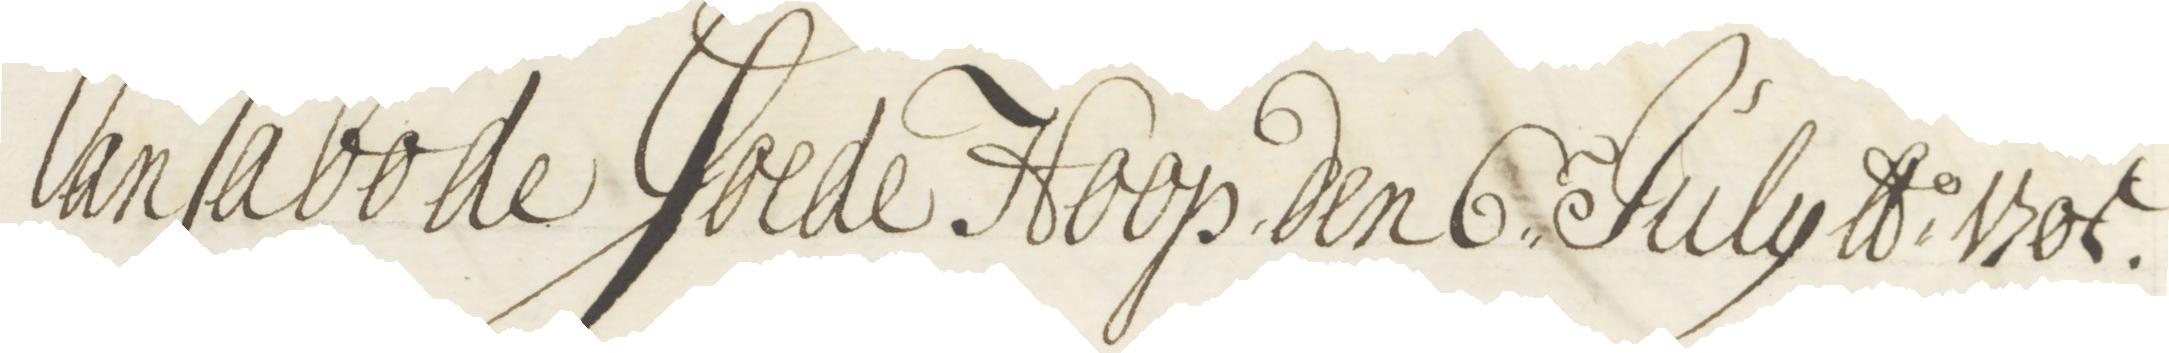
Van Cabo de Goede Hoop, den 6„' July A:o 1705.
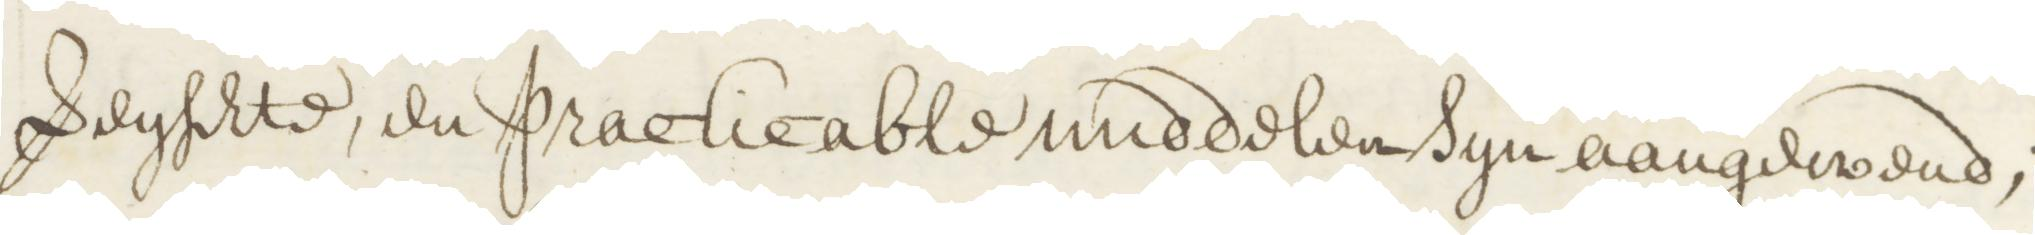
vereyschte, en practicable middelen sijn aangewend;
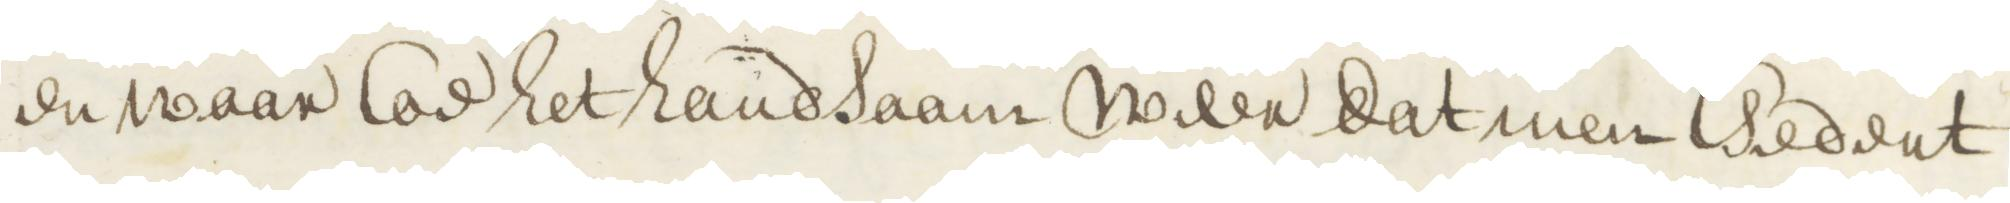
en waar toe het handsaam weer dat men tsedert
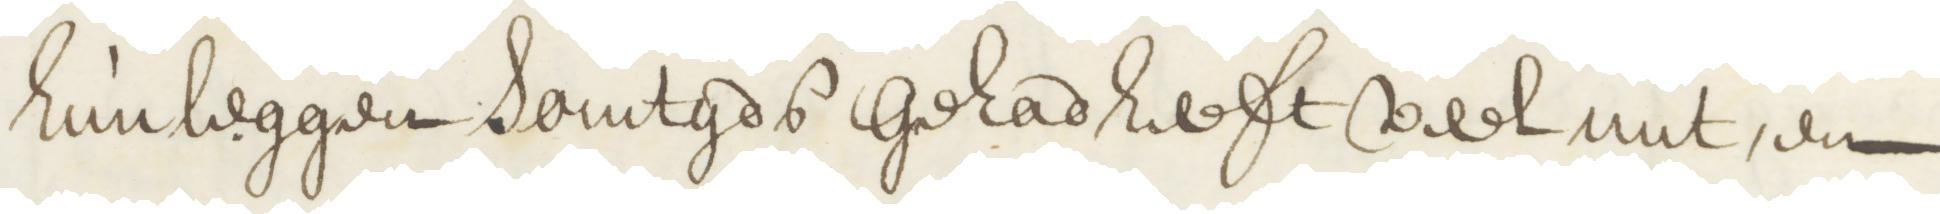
hun leggen somtyds gehad, heeft veel nut, en
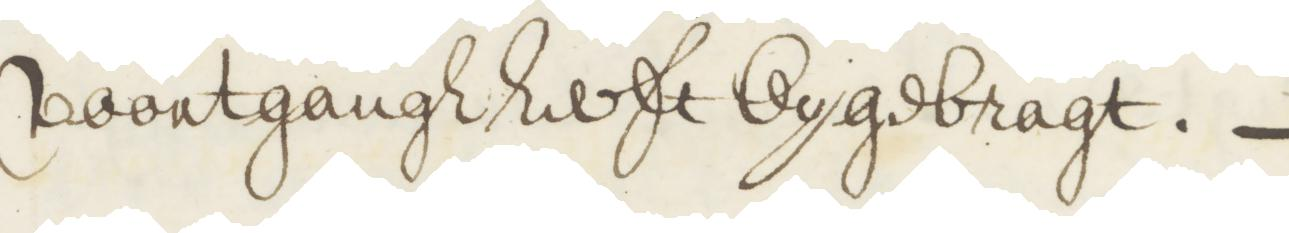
voortgangh heeft bijgebragt.
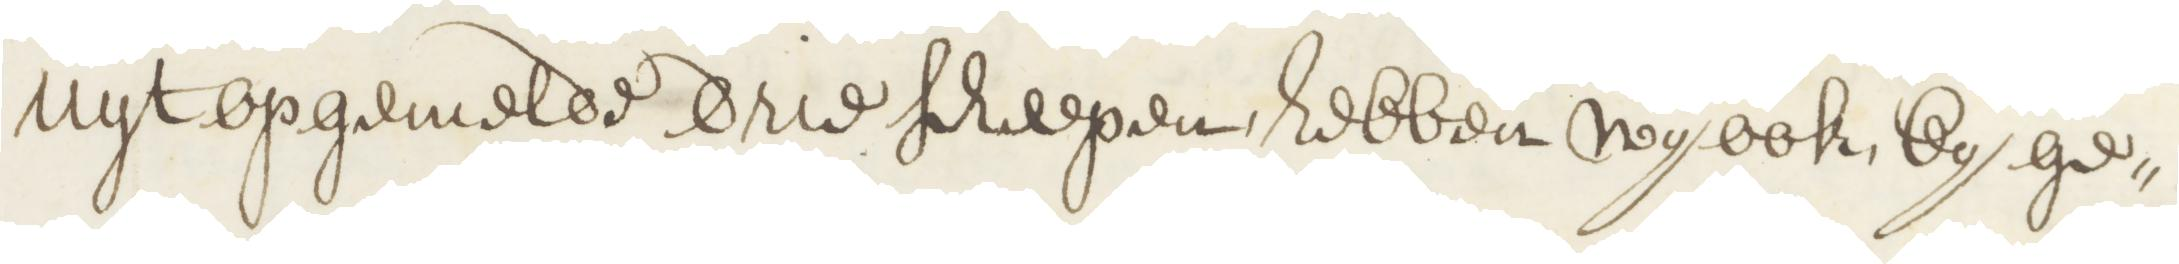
uyt opgemelde drie scheepen, hebben wy ook, by ge„
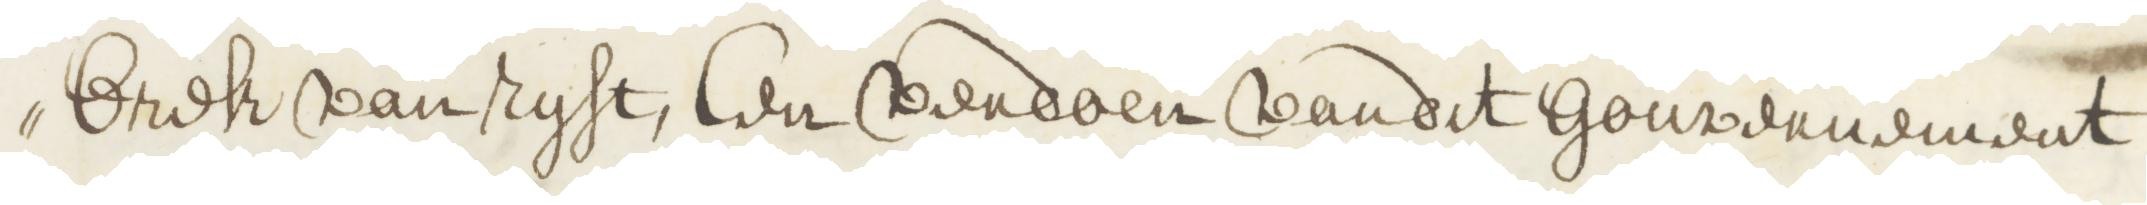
„brek van ryst, ten verdoen van dit gouvernement
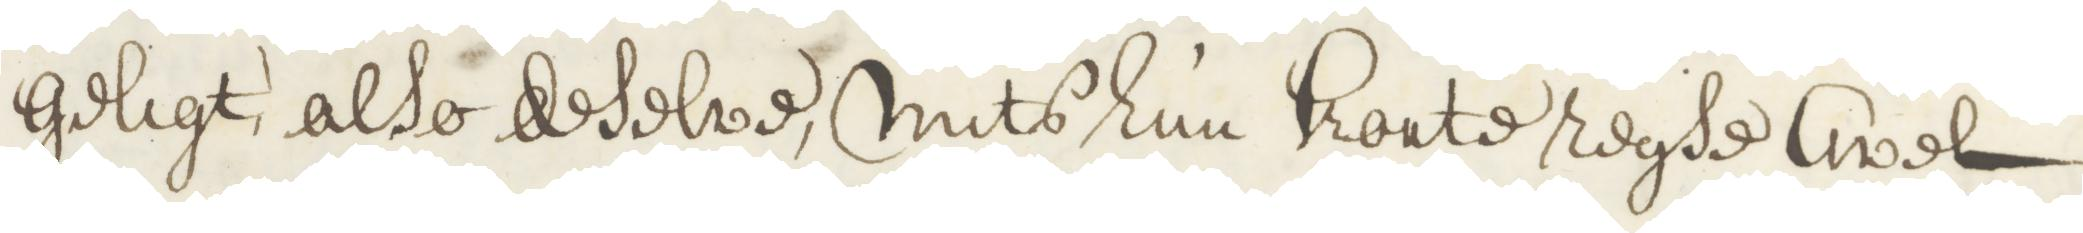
geligt, also deselve, mits hun korte reyse twel
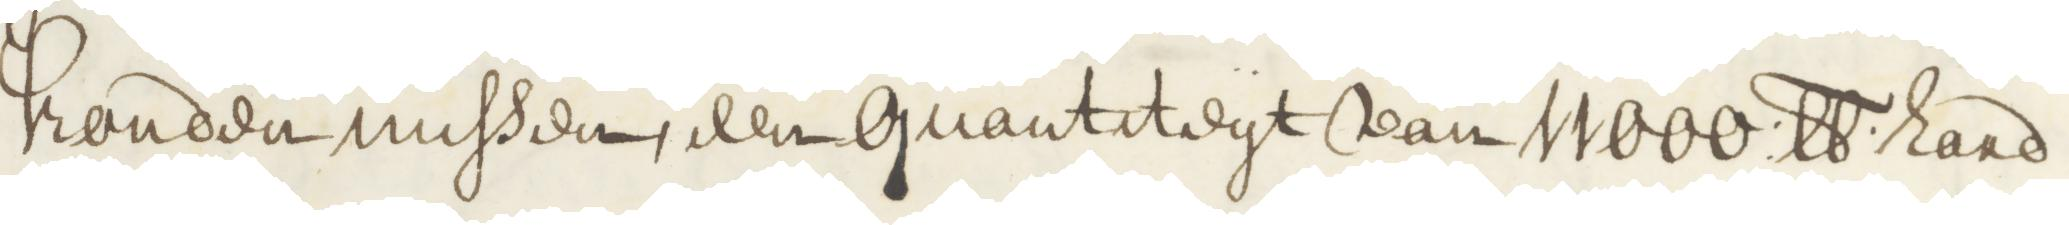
konden missen, een quantiteijt van 11000: lb. hard
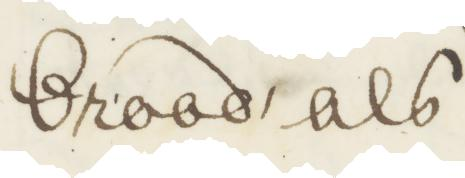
brood, als
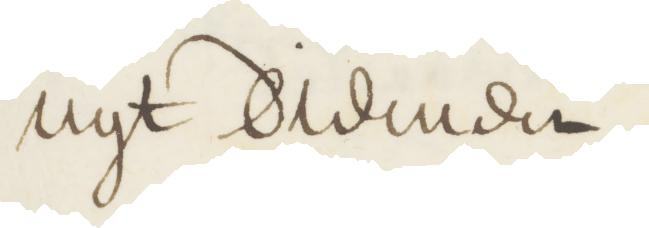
uyt diemen
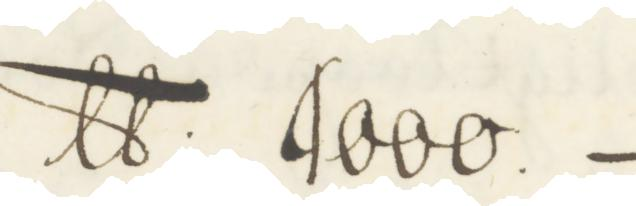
lb: 4000:
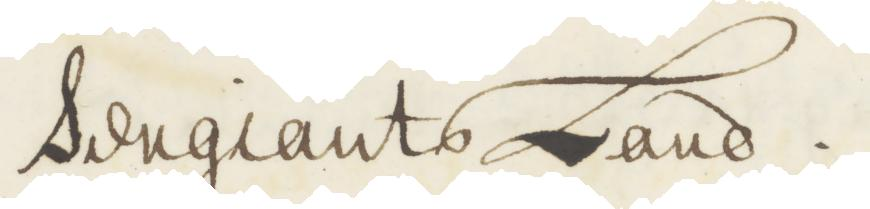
sergiants Land .
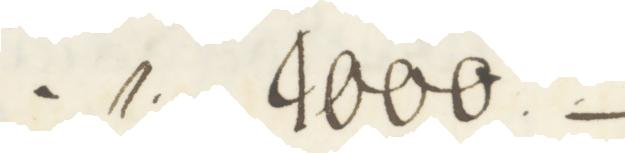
- „. 4000:
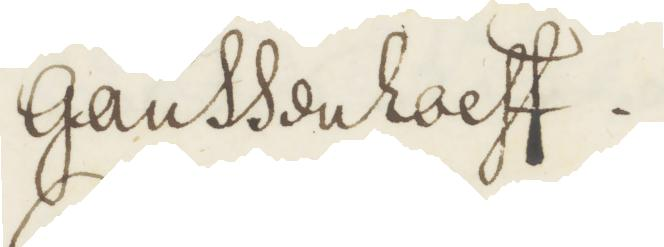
ganssenhoeff .
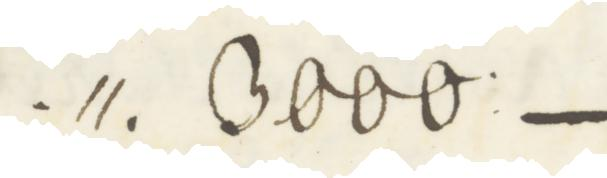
- „. 3000:
